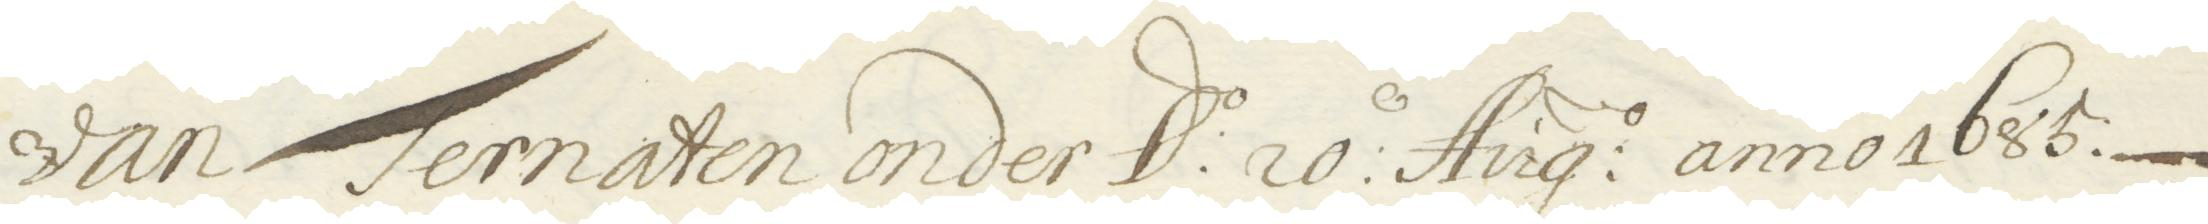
van Ternaten onder d:o 20:e Aug:o anno 1685. —
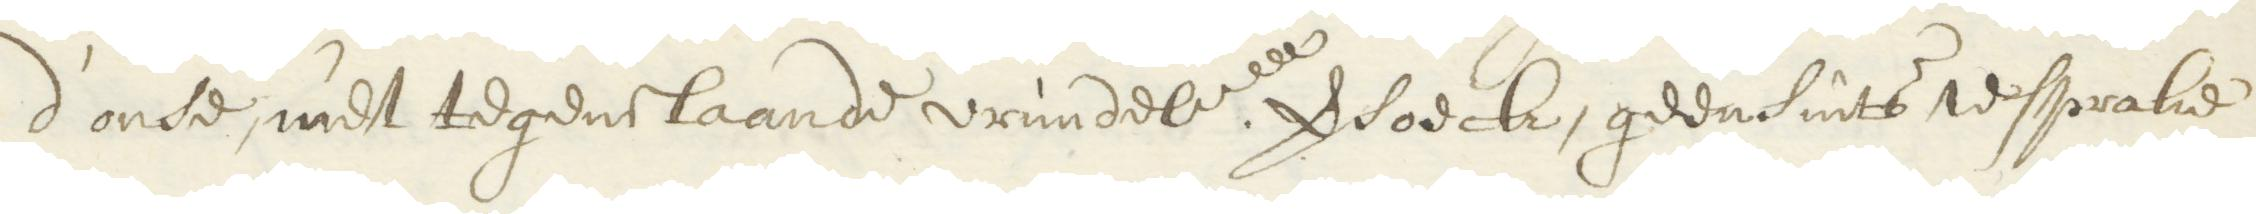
d’ onse, niet tegenstaande vrundelijk versoeck, geen sints te sprake
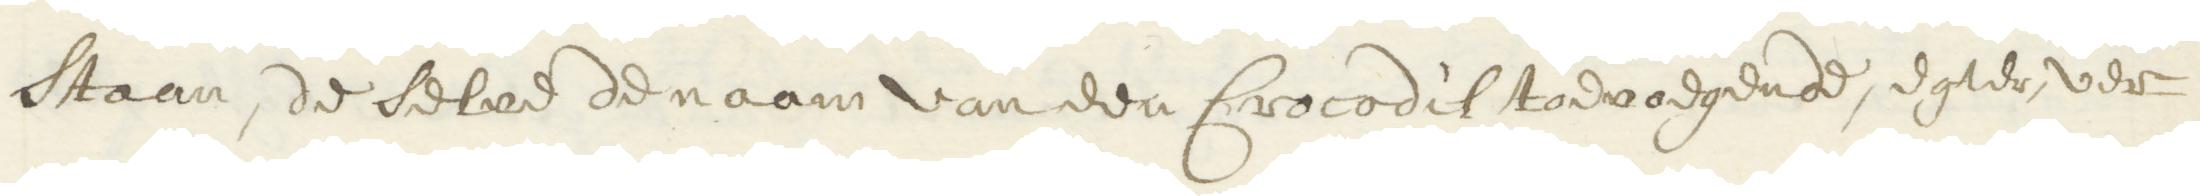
staan, de selve de naam van een Crocodil toevoegende, egter, ver=
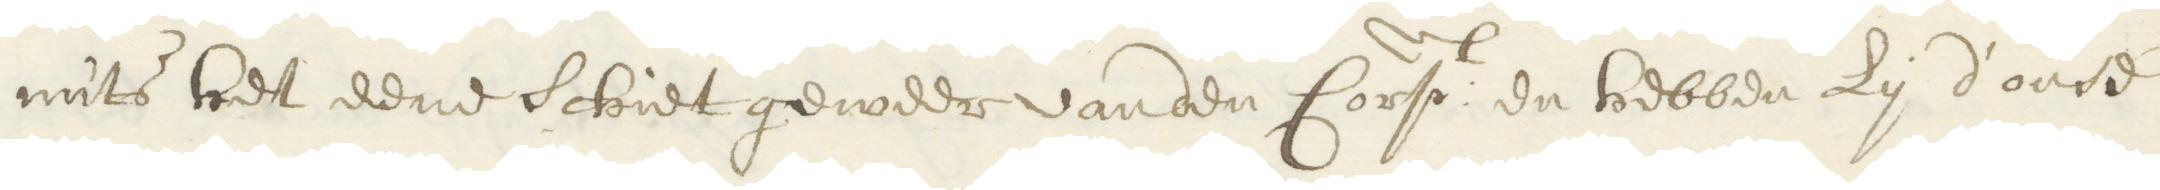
mits het eene schiet geweer van den Corp:l en hebben zij d’ onse
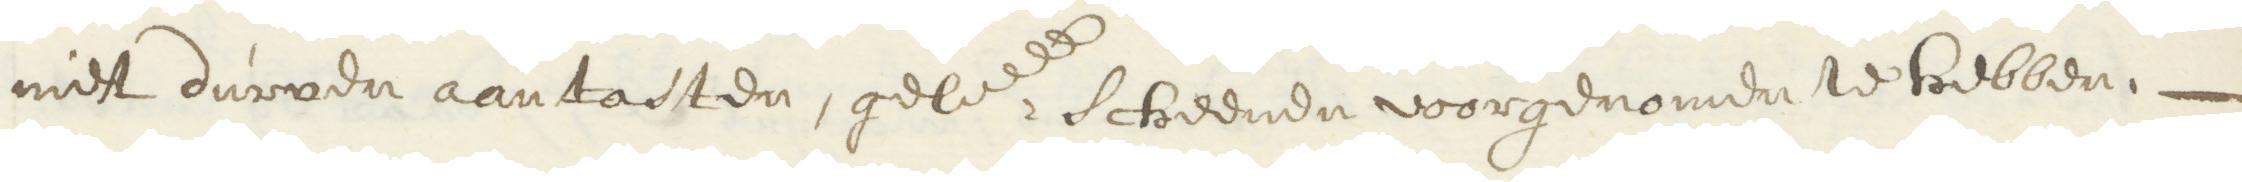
niet durven aantasten, gelijk scheenen voorgenomen te hebben. —
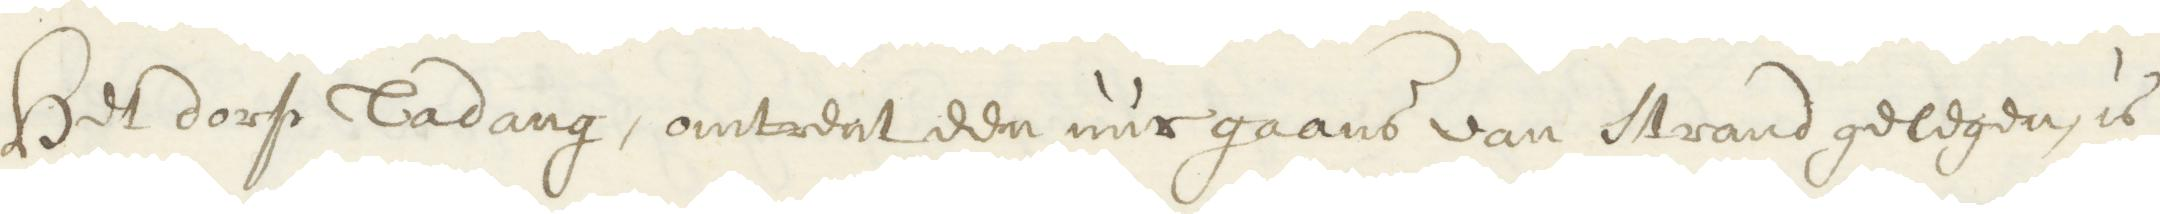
Het dorp Tadang, omtrent een uur gaans van strand gelegen, is
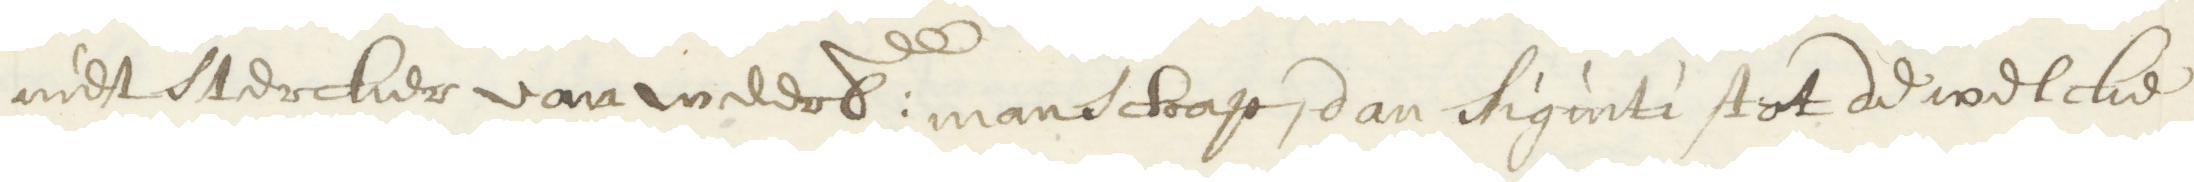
niet stercker van weerlijk manschap, dan siginti tot de welcke
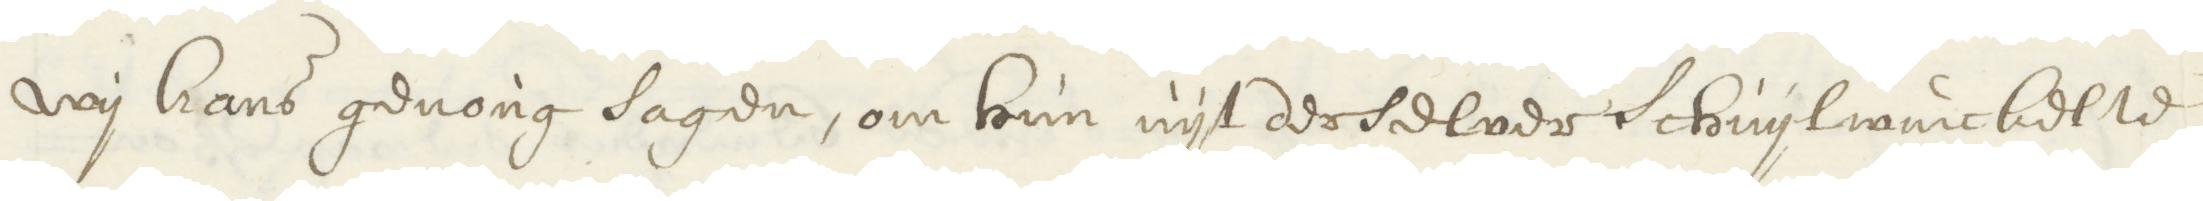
wij kans genoug sagen, om hun uijt derselver schuijlwinckel te
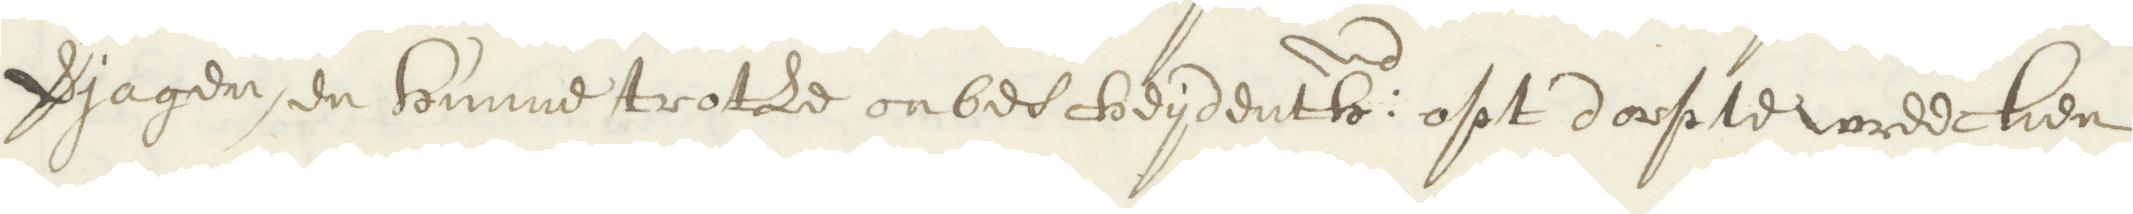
verjagen, en hunne trotze onbescheijdenth:d op ’t dorp te wreecken
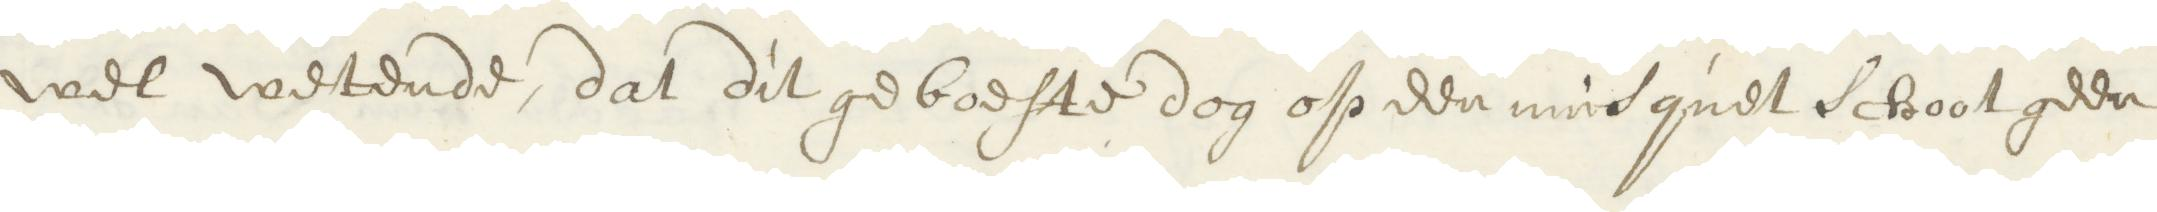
wel wetende, dat dit geboefte dog op een musquet schoot geen
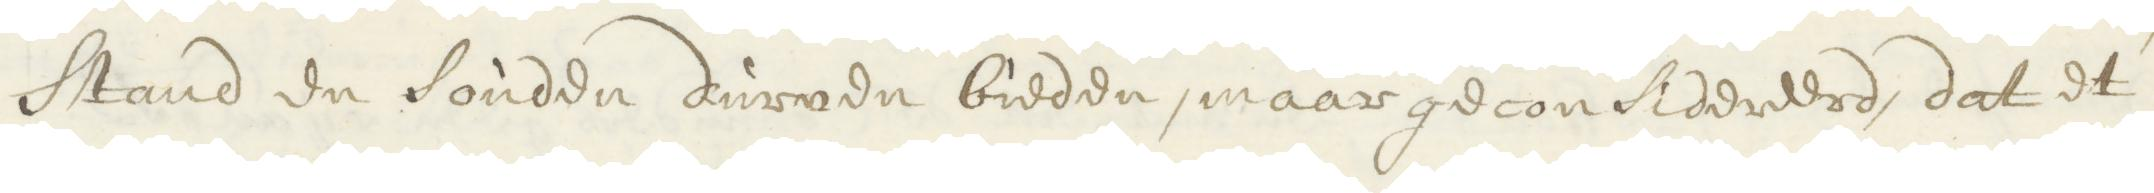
stand en souden durven bieden, maar geconsidereerd, dat et'
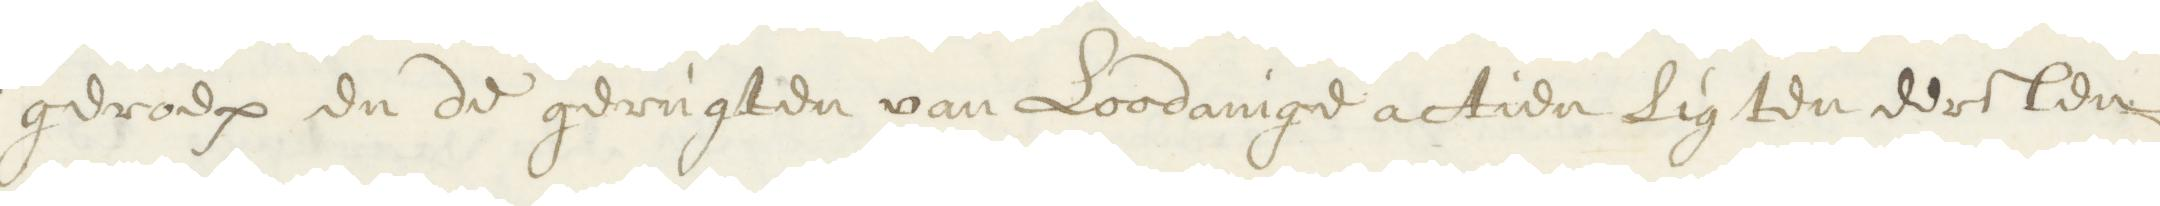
geroep en de gerugten van zoodanige actien sig ten eersten
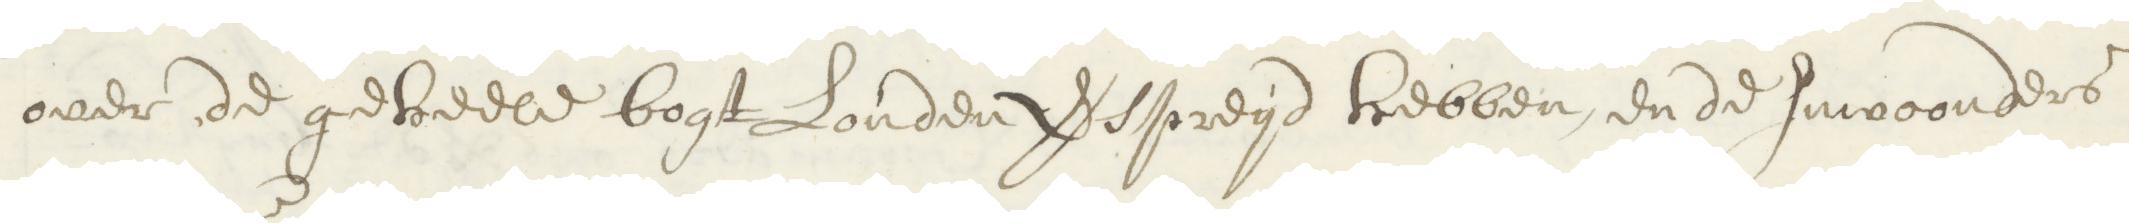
over de geheele bogt zouden verspreijd hebben, en de Inwoonders
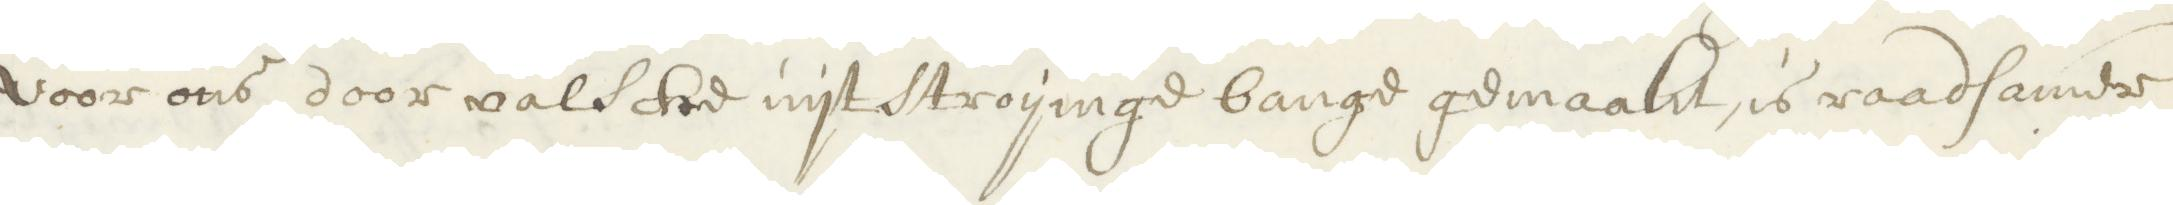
voor ons door valsche uijtstroijnige bange gemaakt, is raadsamer
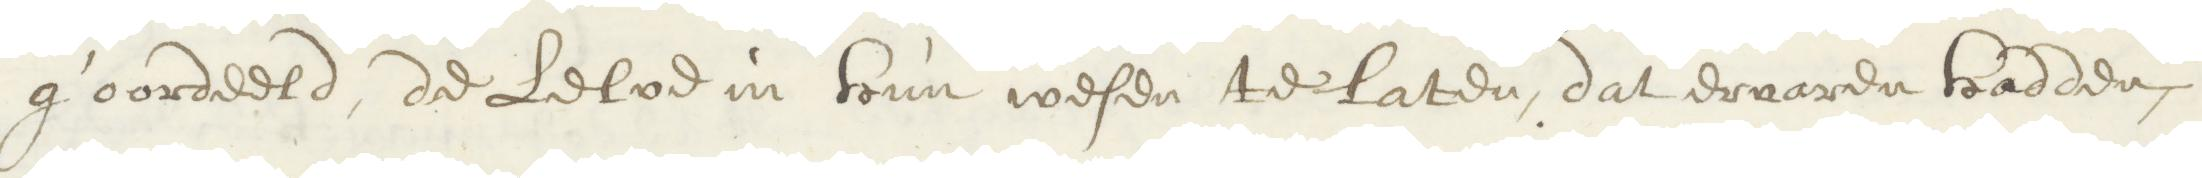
g’oordeeld, de zelve in hun wesen te laten,. dat ervaren hadden,
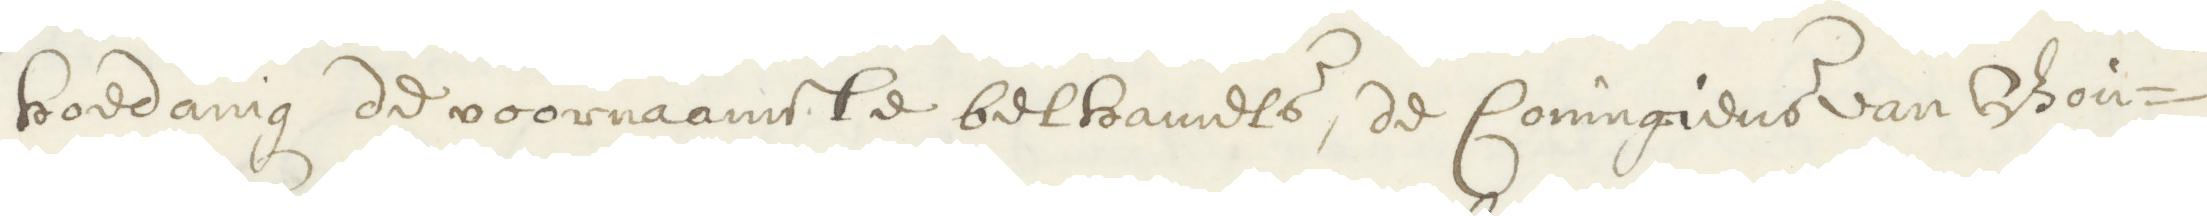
hoedanig de voornaamste belhamels, de Coningiens van hhou=
